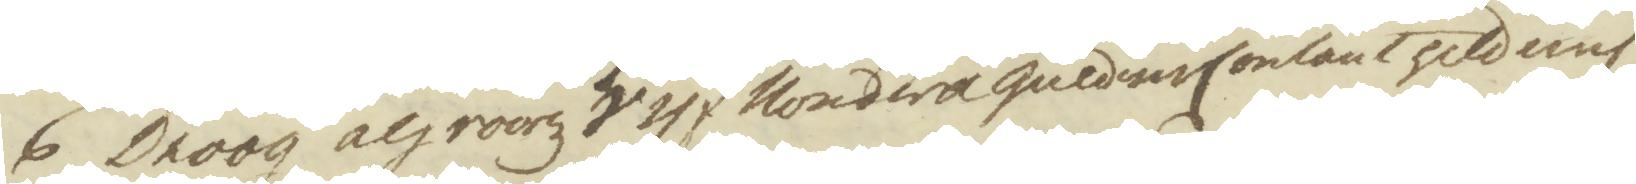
Droog als vooren vyf Honderd guldens Contant geld eens.
